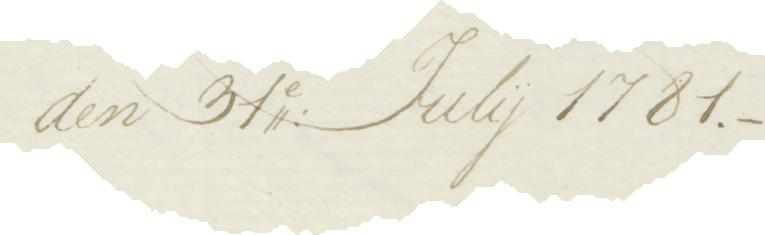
den 31„e: Julij 1781. –
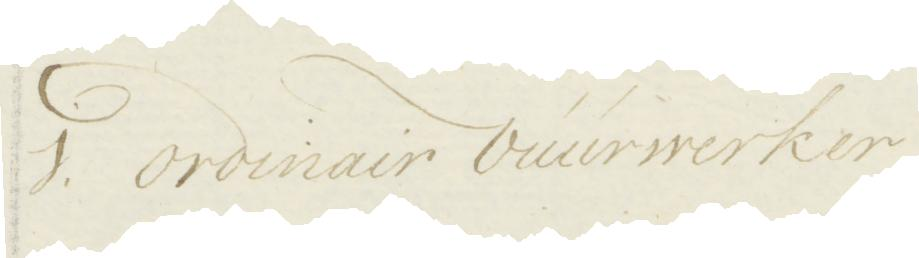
1. ordinair vuurwerker
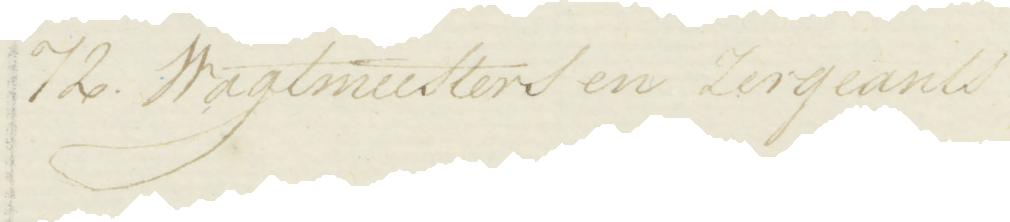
72. Wagtmeesters en zergeants
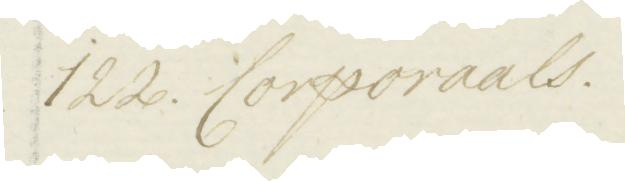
122. Corporaals.
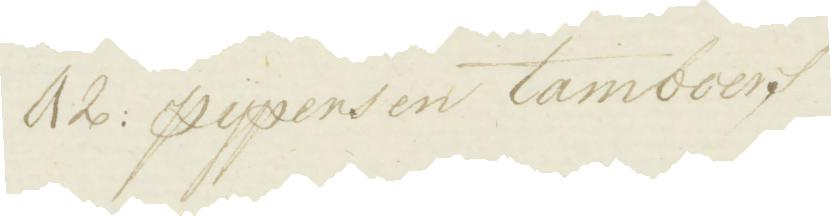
42: pijpers en tamboers
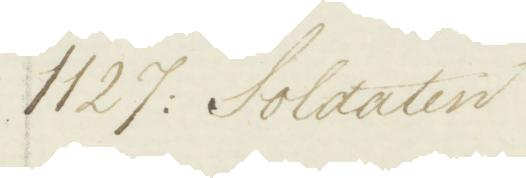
1127: soldaten
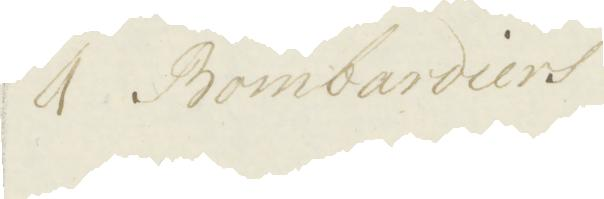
4 Bombardiers
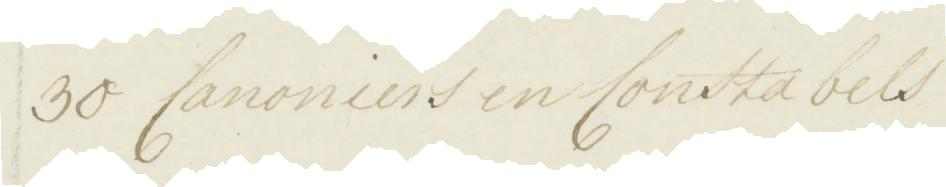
30 Canoniers en Constabels
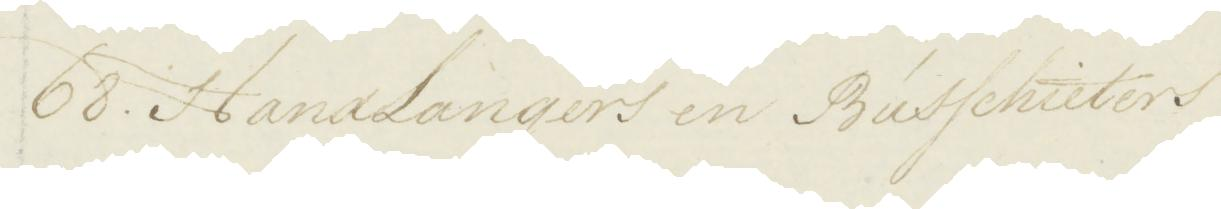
68. Handlangers en Busschieters
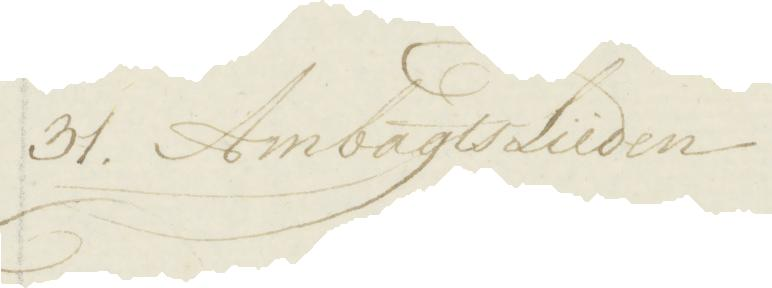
31. Ambagtslieden.
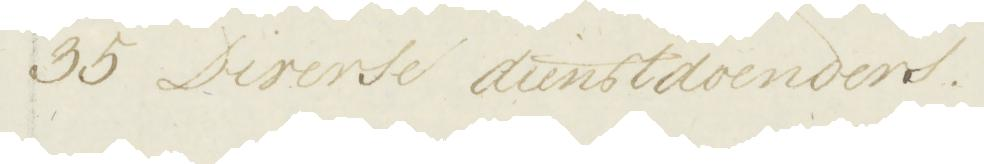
35 Diverse dienstdoenders.
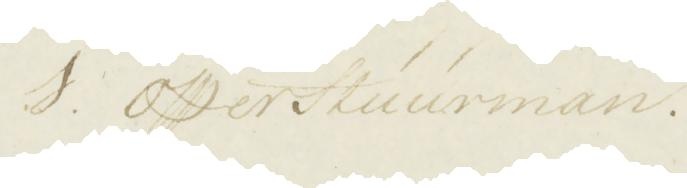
1. opperstuurman
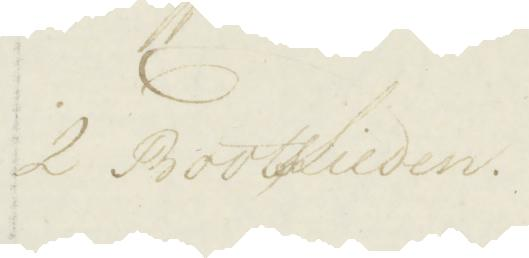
2 Bootslieden.
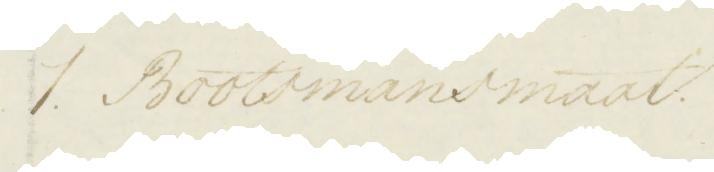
1. Bootsmansmaat.
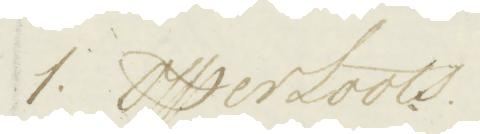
1. opperloots.
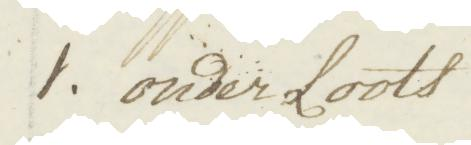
1. onder loots
